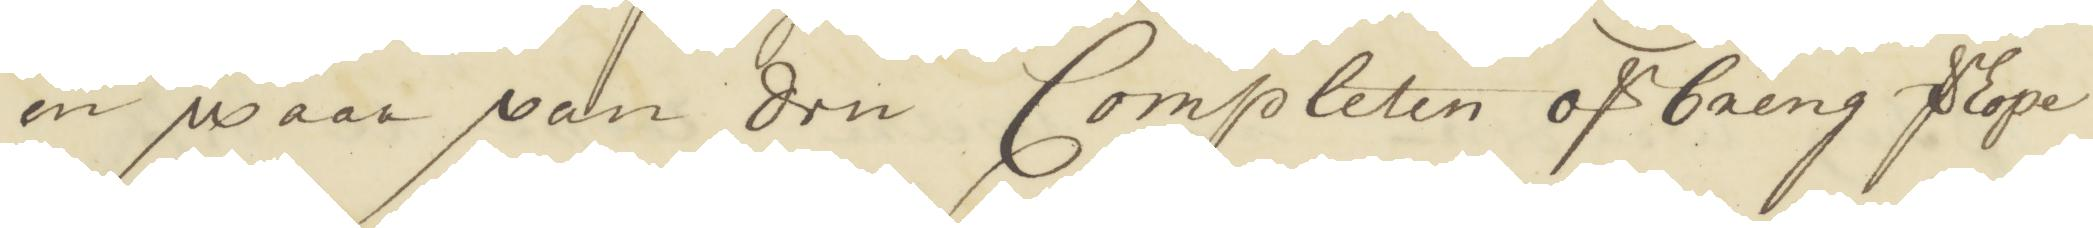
en waar van den Completen opbreng verhope
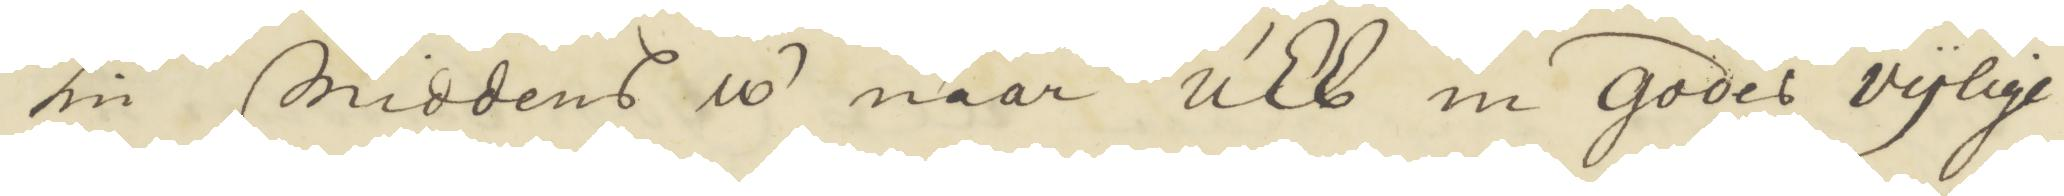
in middens w' naar uEE in godes vijlige
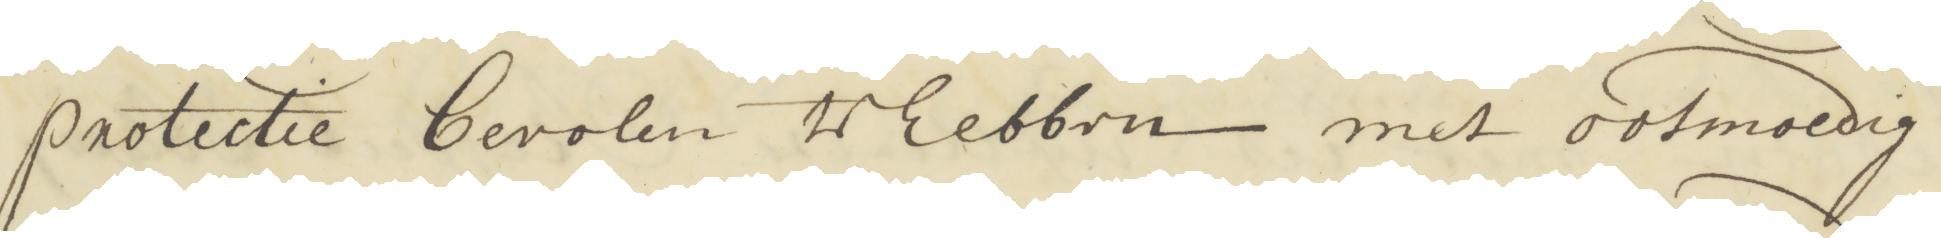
protectie bevolen te hebben met ootmoedig
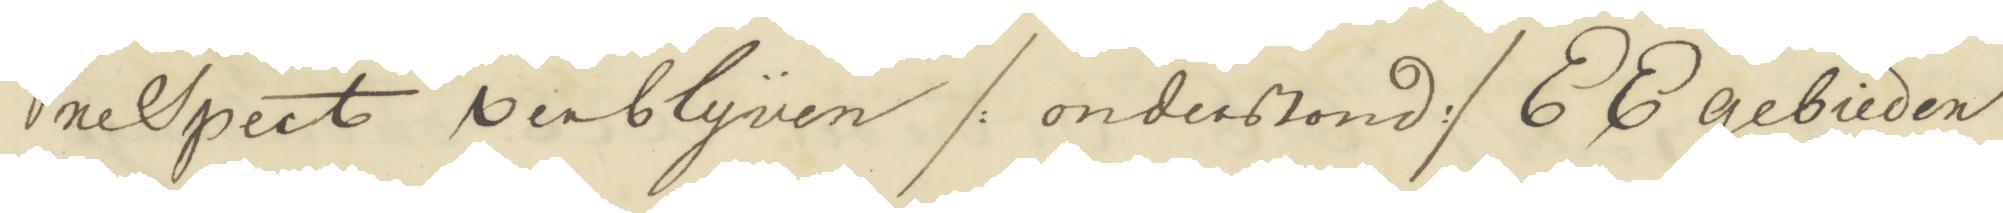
respect verblijven /:onderstond:/ E E gebieder
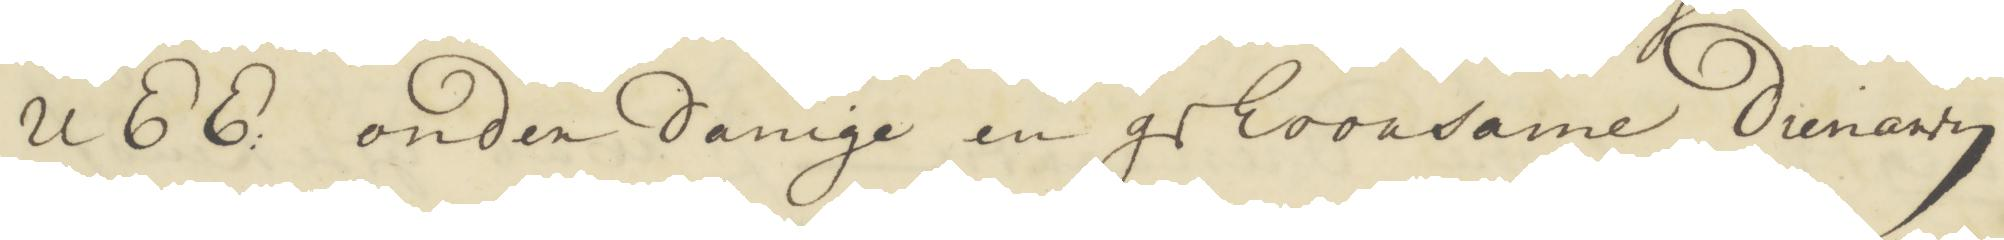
U E E: onder danige en gehoorsame dienaren
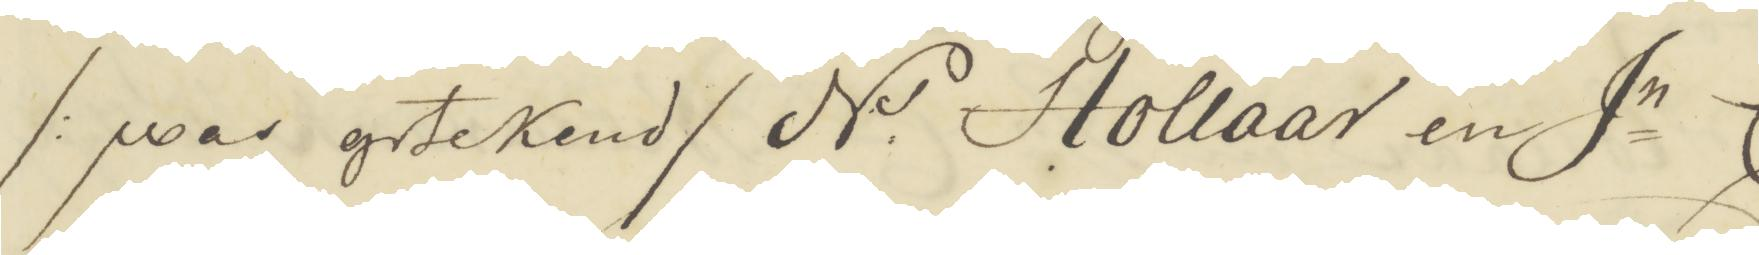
/:was getekend/ N:s Hollaar en J=n C=l
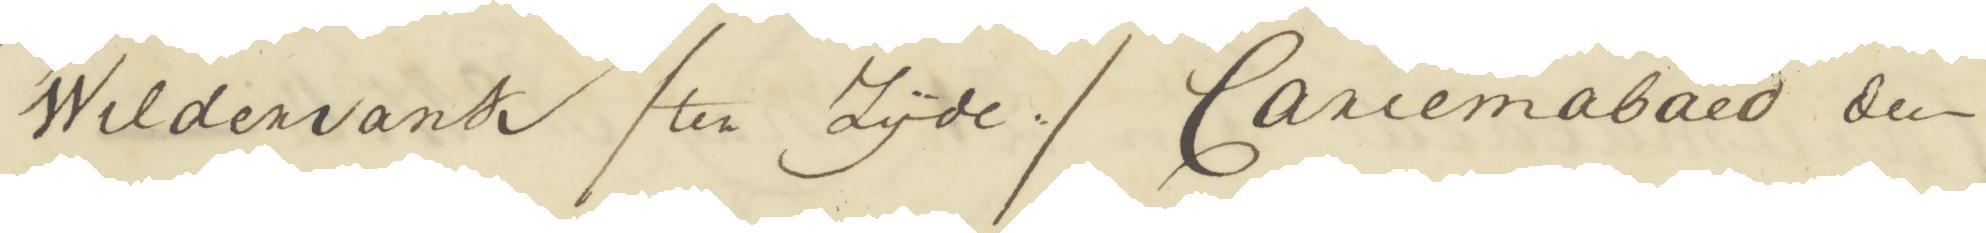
Wildervank /ter zijde:/ Cariemabaed den
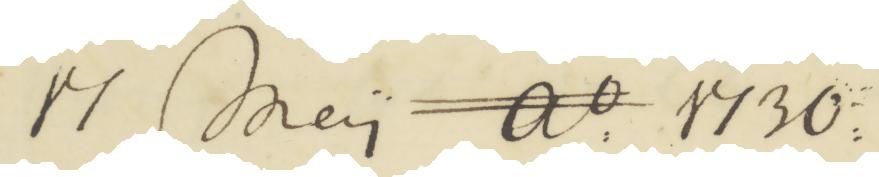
17 Meij a=o 1730:
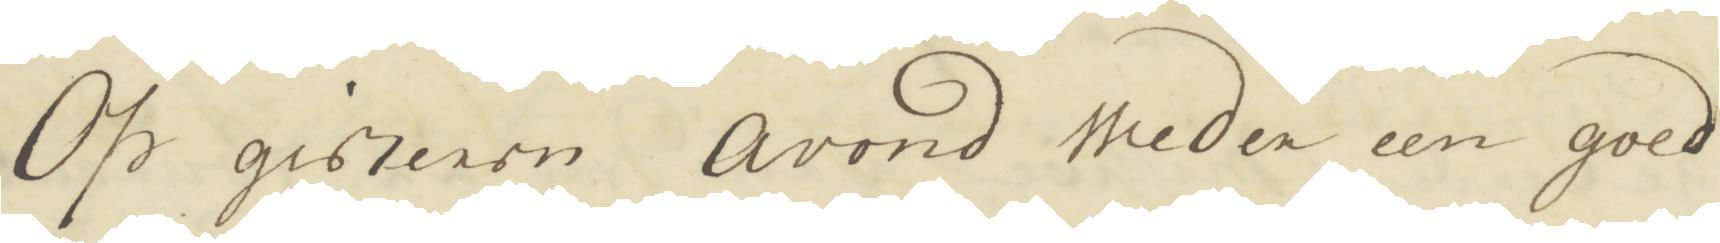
Op gisteren Avond weder een goed
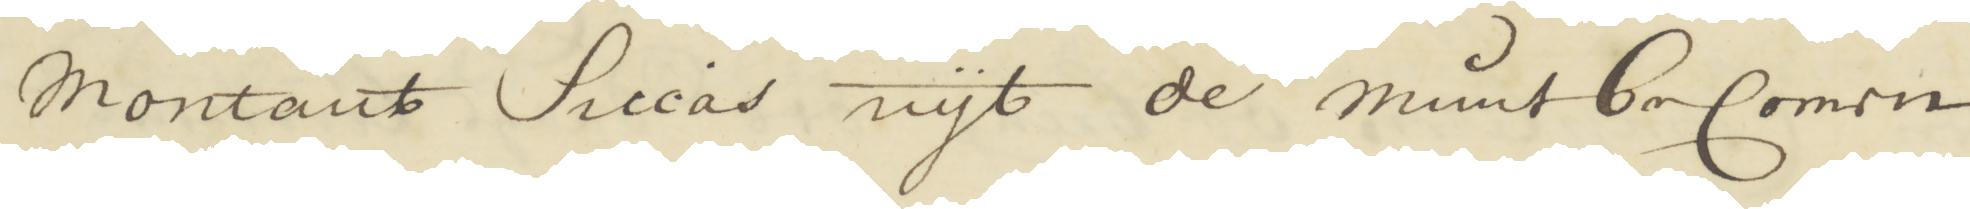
Montant Siccas uijt de munt becomen
